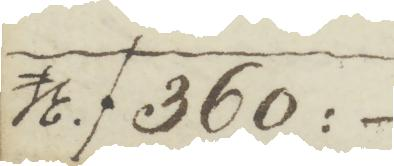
Tr. ƒ 360: —
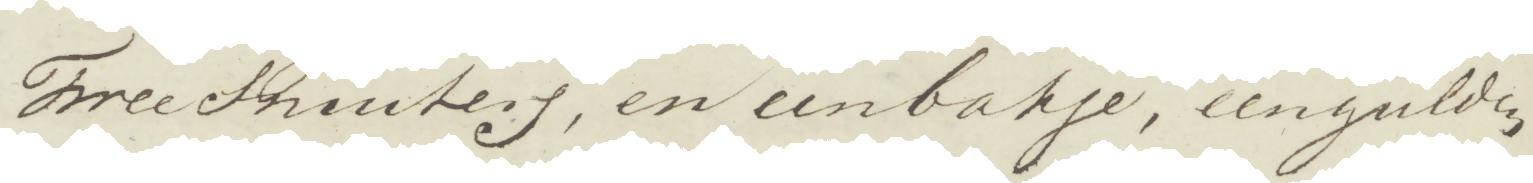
Twee Snuiters, en een bakje, een gulden
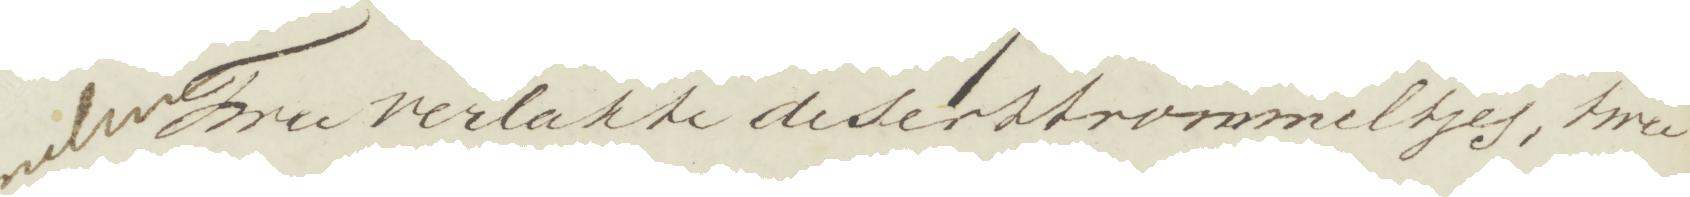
Twee verlakte deserttrommeltjes, twee
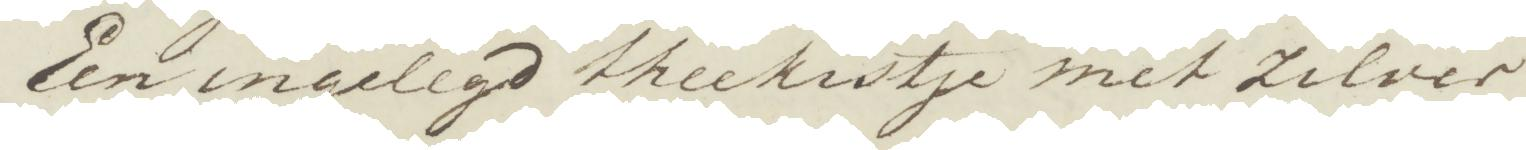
Een ingelegd theekistje met zilver
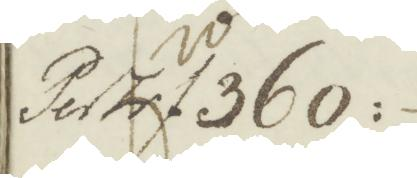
Per Trp ƒ360: —
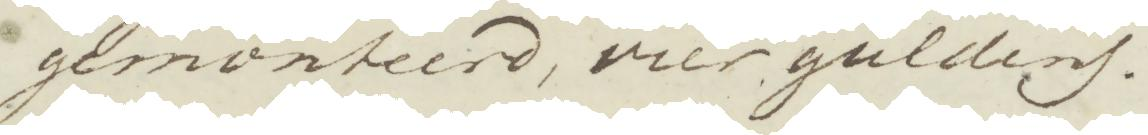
gemonteerd, vier guldens.
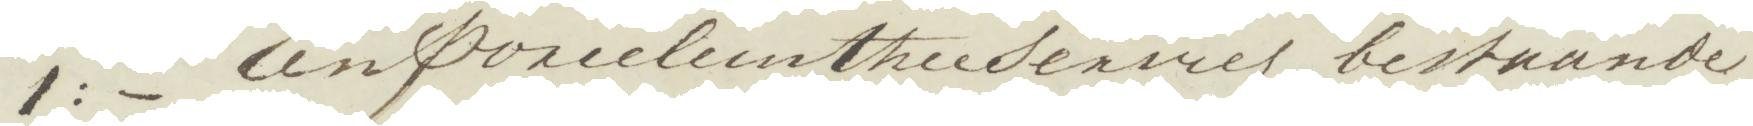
1: — Een Porcelein theeservies, bestaande
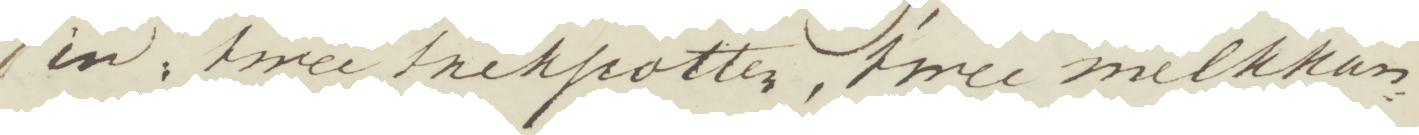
in: twee trekpotter, twee melkkan„
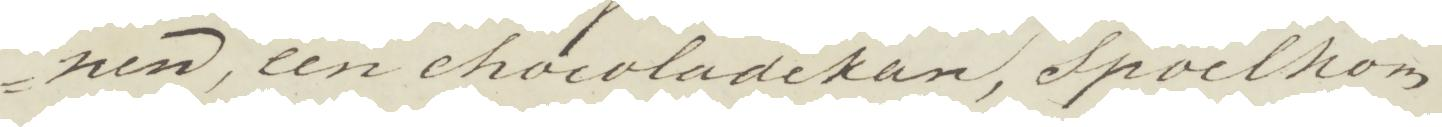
=nen, een chocoladekan, spoelkom
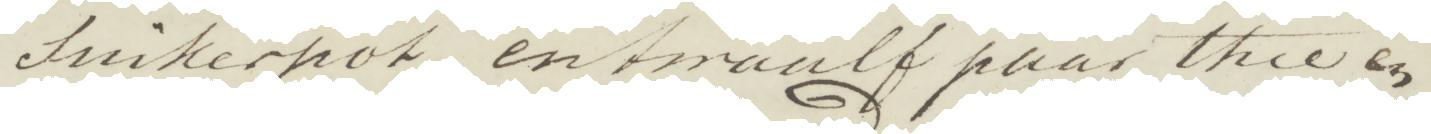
suikerpot, en twaalf paar thee en
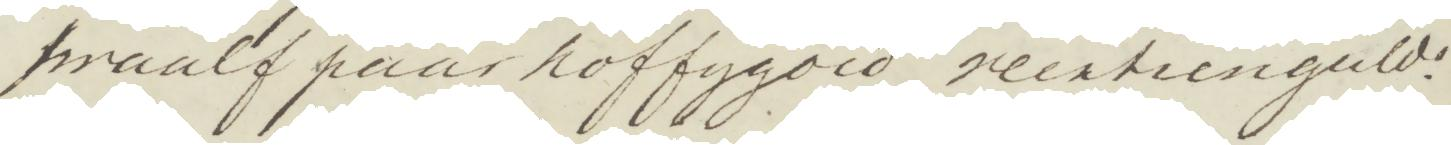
twaalf paar koffijgoed, veertien guld.s
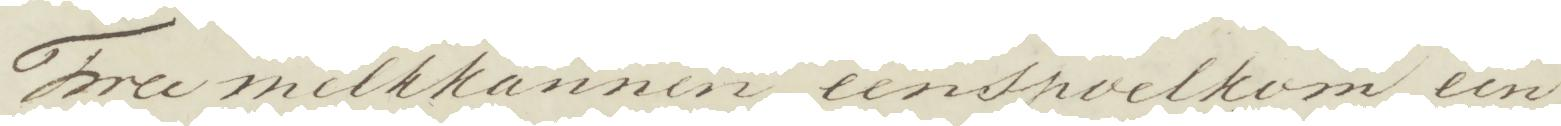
Twee melkkannen een spoelkom, een
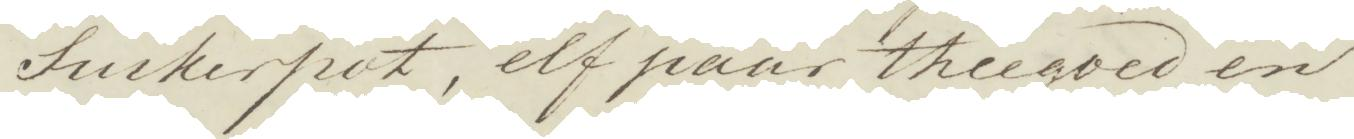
suikerpot, elf paar theegoed en
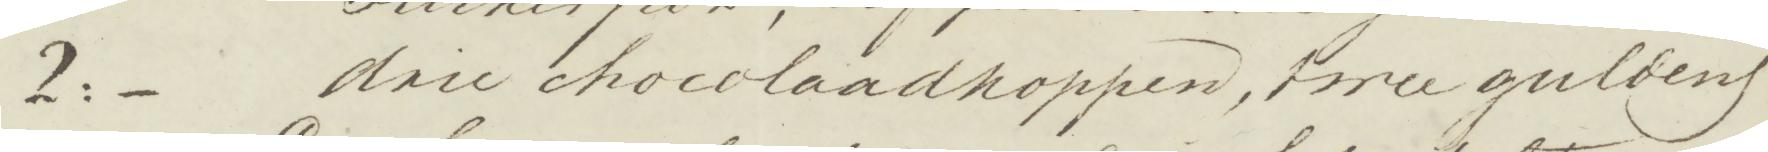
2: — drie chocolaadkoppen, twee guldens
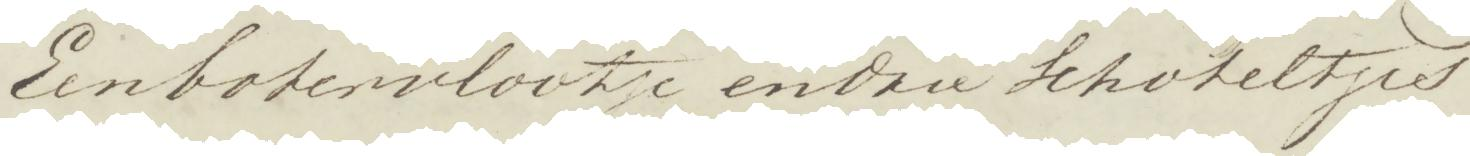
Een botervlootje en drie schoteltjes
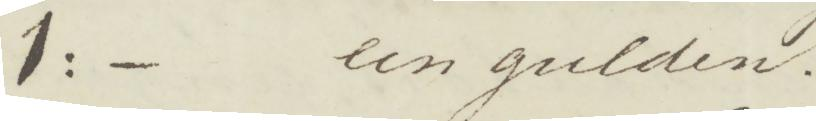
1: — een gulden.
